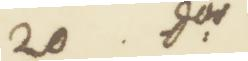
20 d:os
